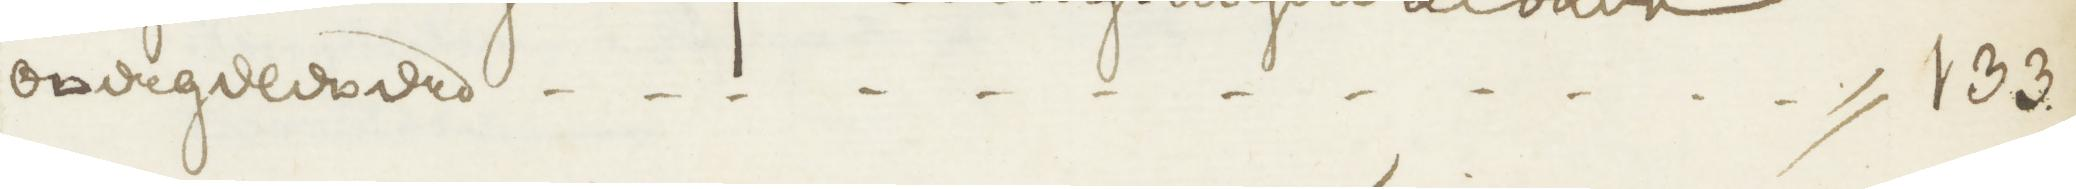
overgeleverd. - - - - - - - - - - - -„133.
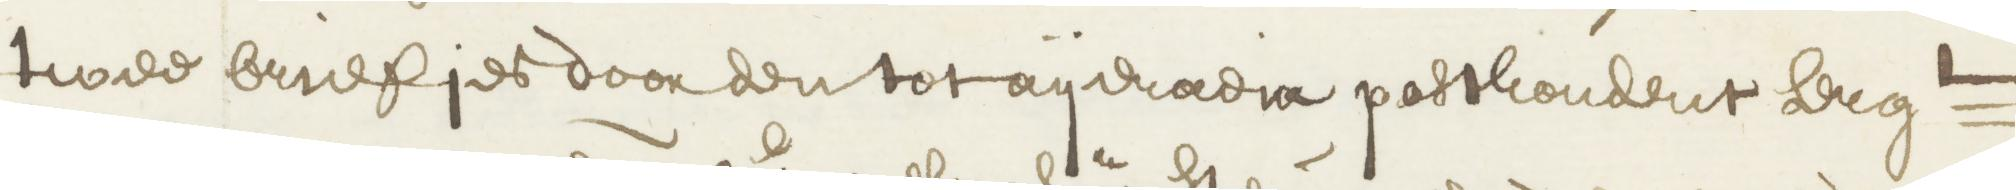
twee briefjes door den tot aijeradia posthoudent serg=t
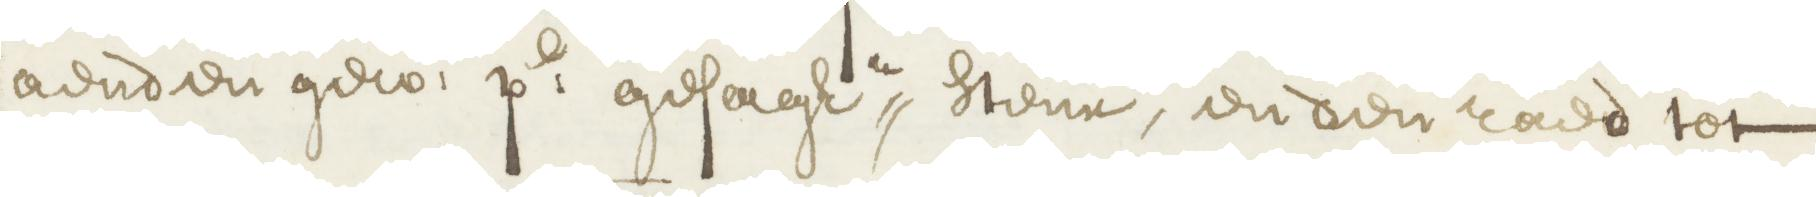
aenden gew: p:e gesagh=n steur, en den raed tot
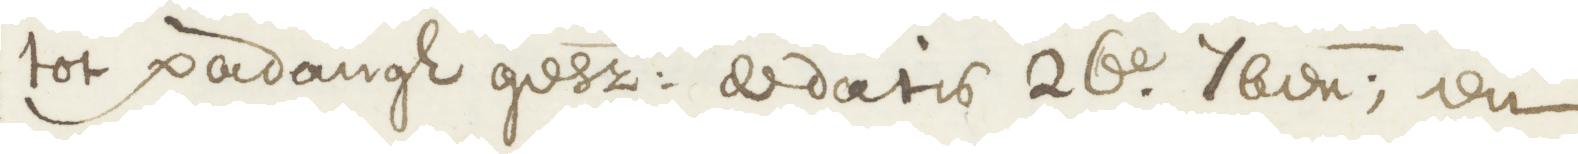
tot padangh gesz: de datis 26.e 7ber; en
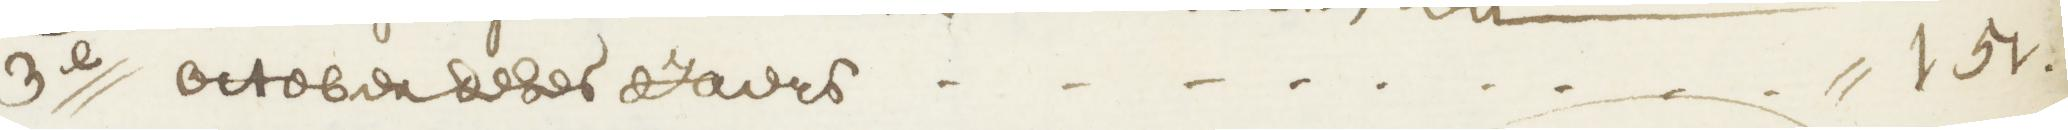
3„e october deses Iaers - - - - - - - - - „151.
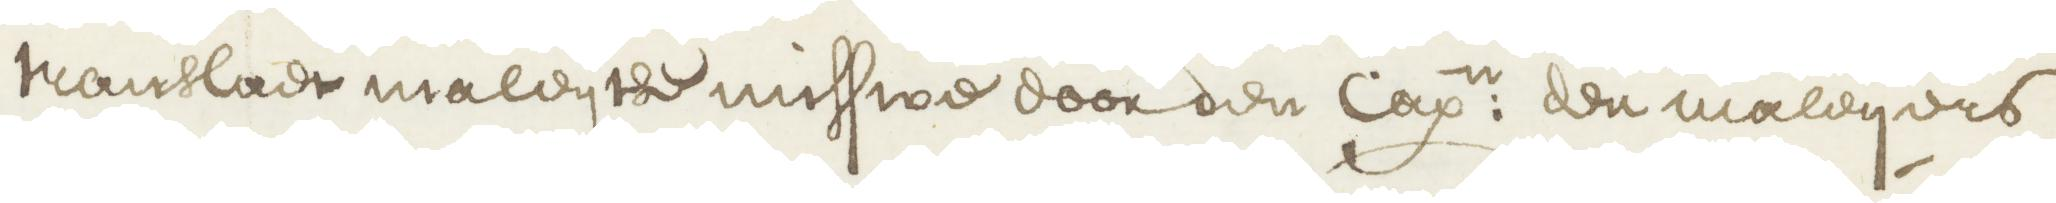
translaet maleijtse missive door den capn: den maleijers
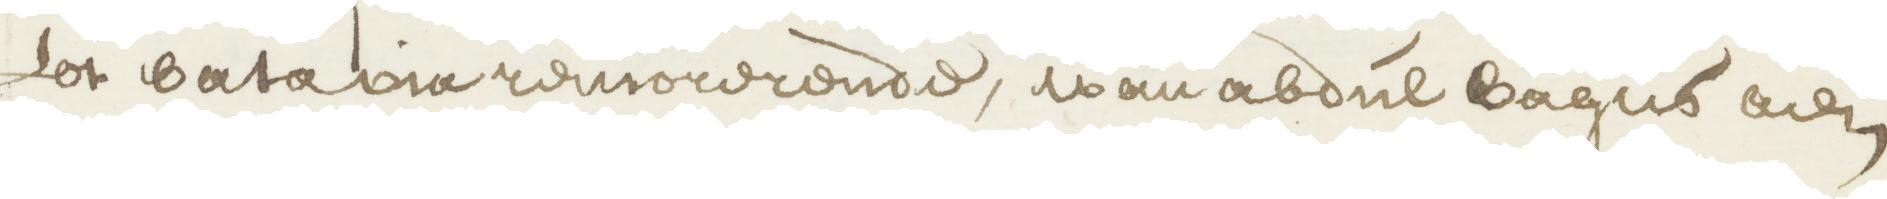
tot batavia remorerende, wan abdul bagus aen
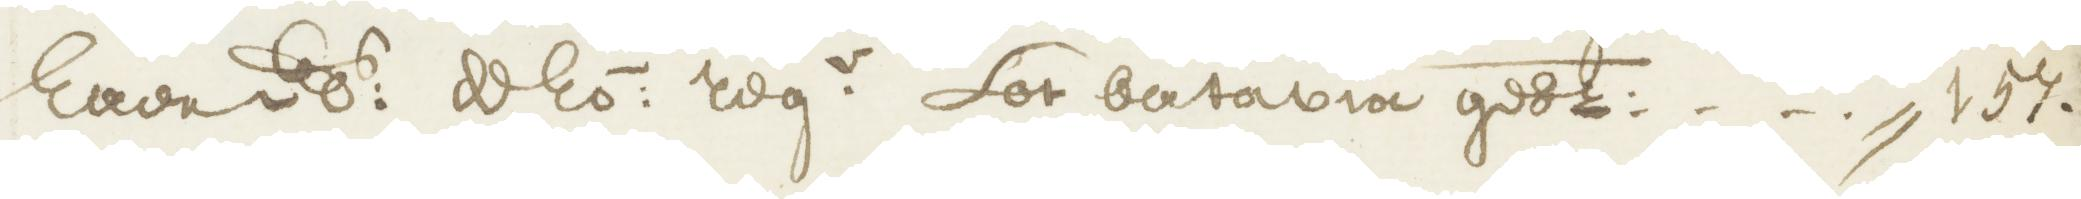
haer Ed:s de ho: reg.e tot batavia gesz: - - - -„157.
